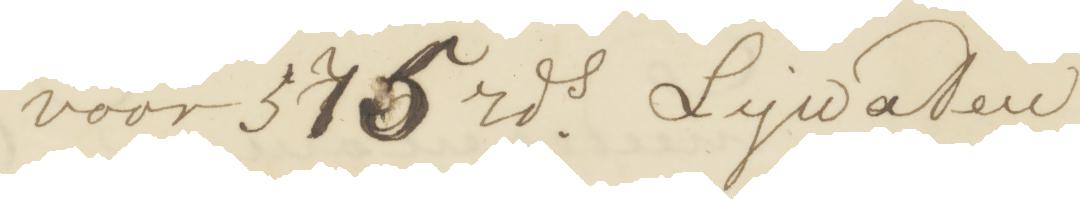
voor 575 rd.s Lijwaten
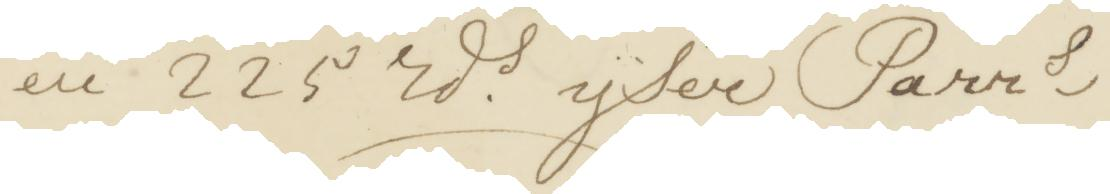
en 225 rd.s ijser Parr's
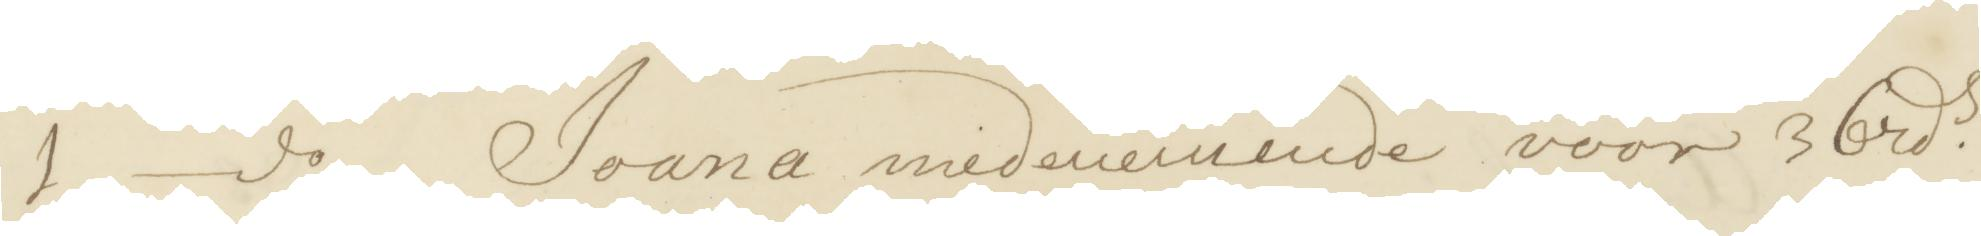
1 d.o „ Joana medenemende voor 36 rd.s
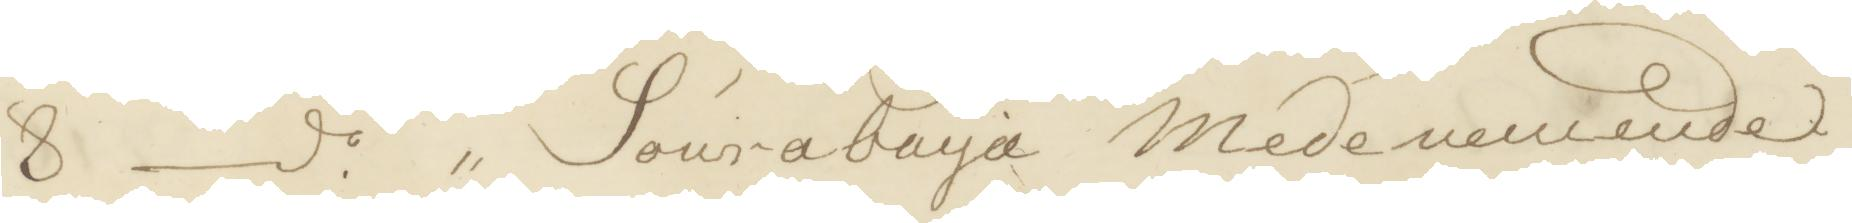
8 d.o „ Sourabaija medenemende
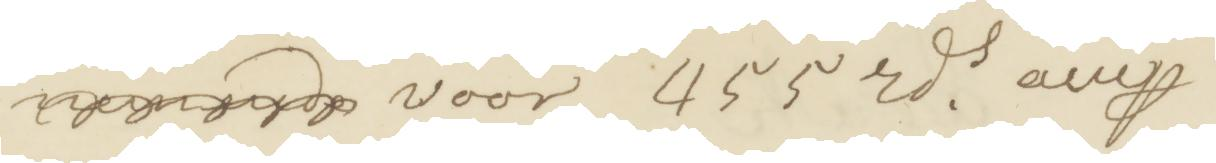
nemend voor 455 rd.s amp
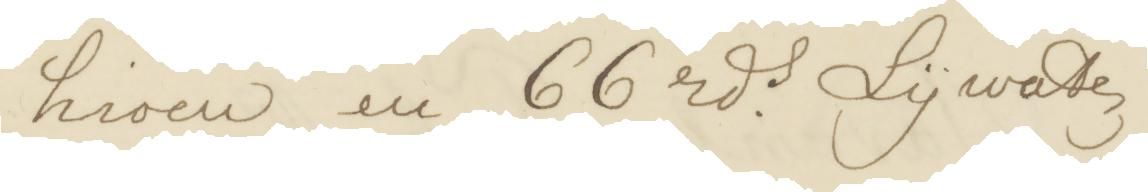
hioen en 66 rd.s Lijwaten
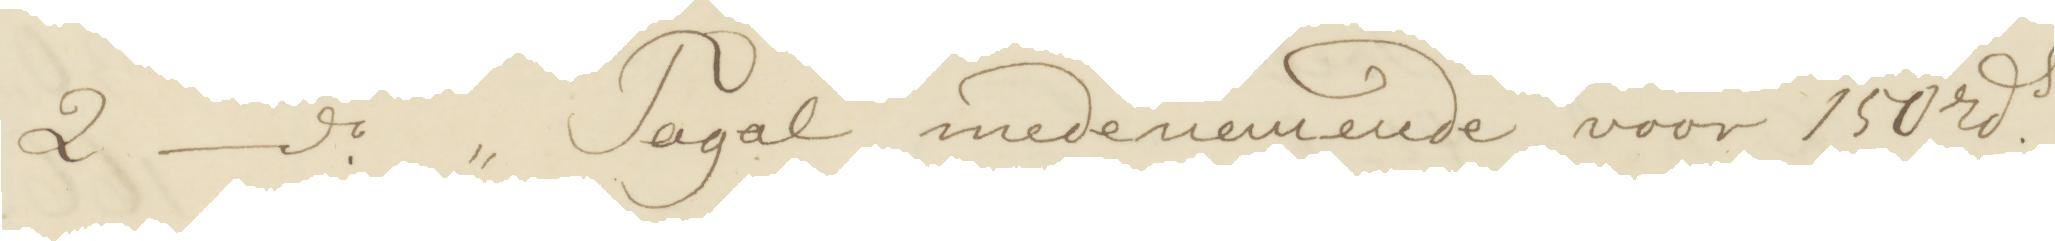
2 d.o „ Tagal medenemende voor 150 rd.s
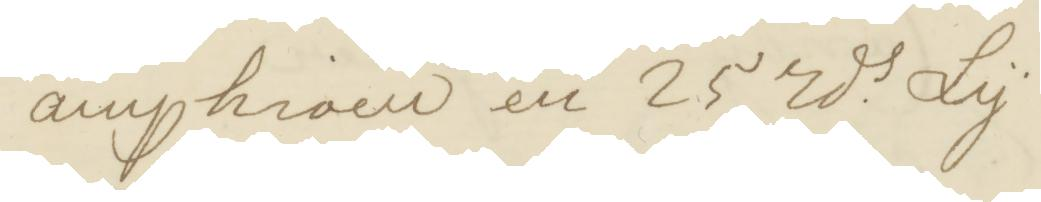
amphioen en 25 rd.s Lij
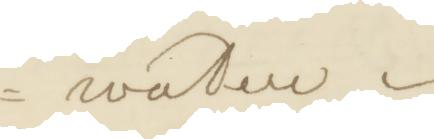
=waten
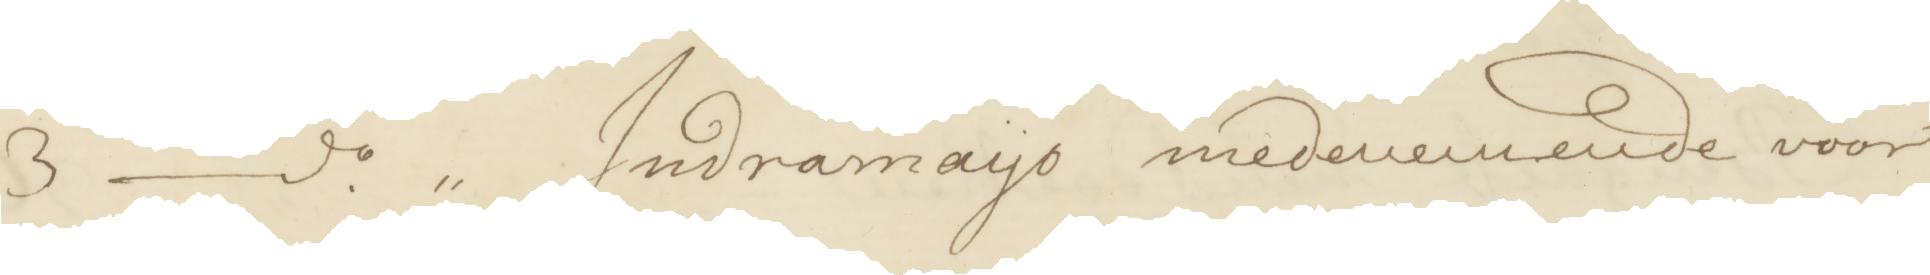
3 d.o „ Jndramaijo medenemende voor
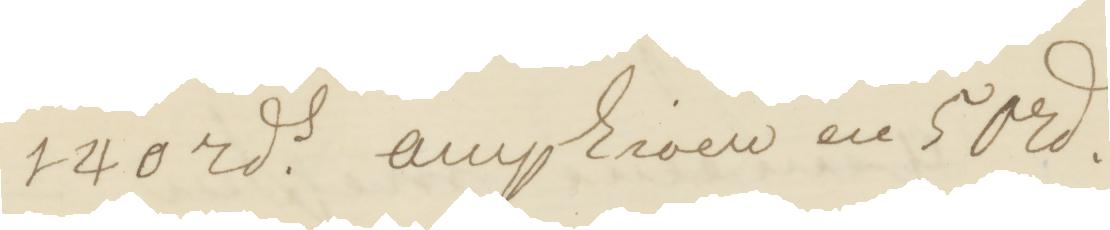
140 rd.s amphioen en 50 rd.s
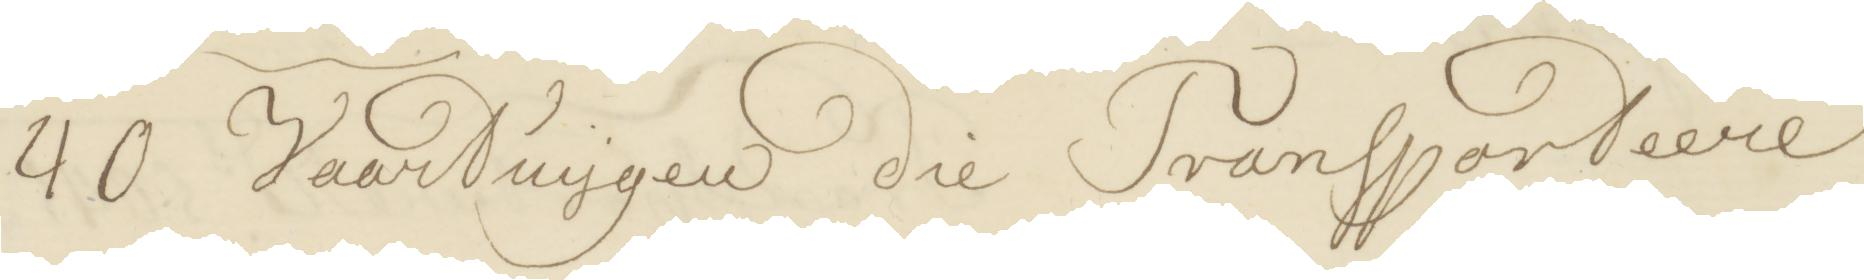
40 Vaartuijgen die Transporteere
